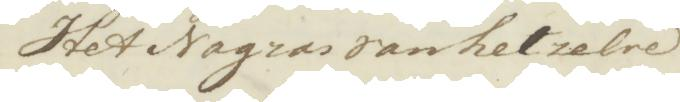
Het Nagras van hetzelve
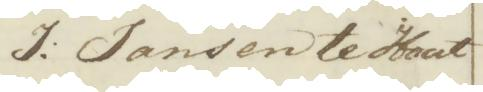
I: Iansen te Hout
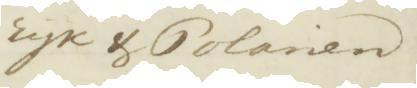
rijk & Polanen
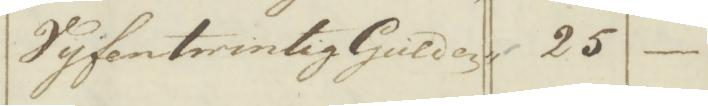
Vyfentwintig Gulden „- 25 —
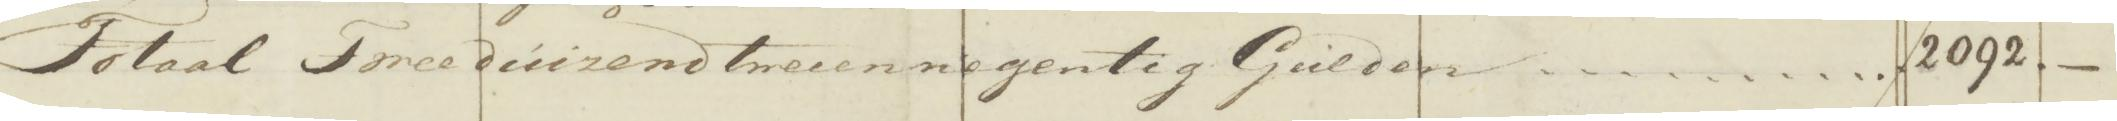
Totaal Twee duizend tweeennegentig Gulden - - - - - - , , , .f 2092.—
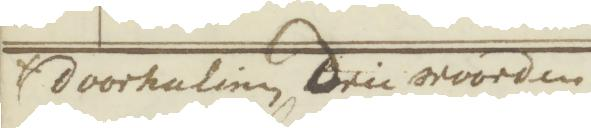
doorhaling drie woorden
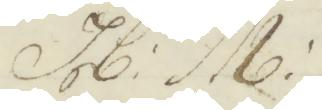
H: M:
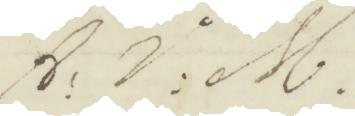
A: V: M:
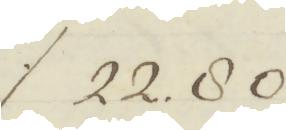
ƒ 22.80
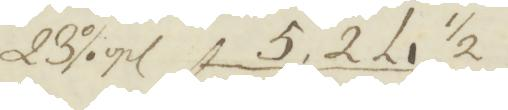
23%opc 5.24½
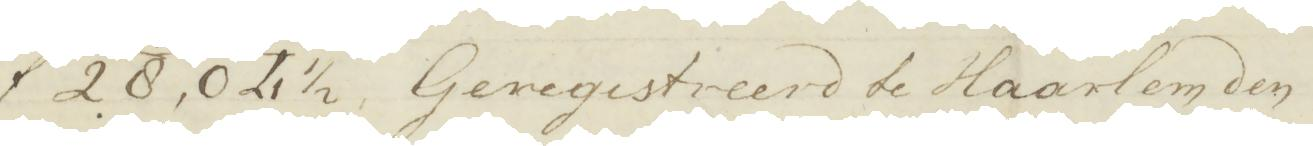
ƒ 28,04½ Geregistreerd te Haarlem den
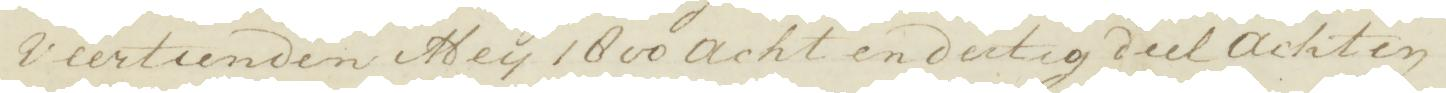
Veertienden Mey 1800 acht en dertig deel acht en
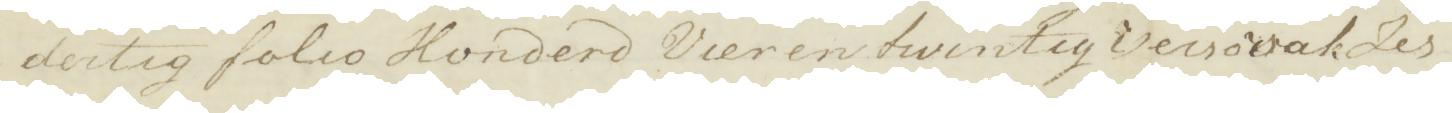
dertig folio Honderd Vier en twintig verso vak Zes
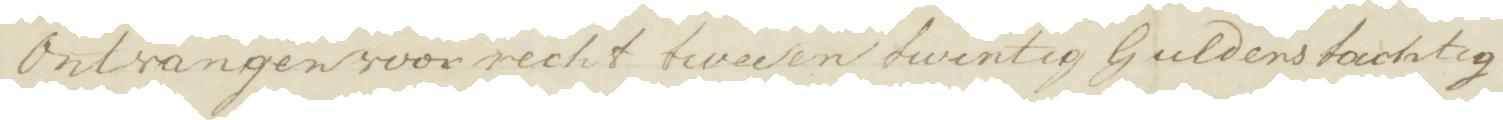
ontvangen voor recht twee en twintig Guldens tachtig
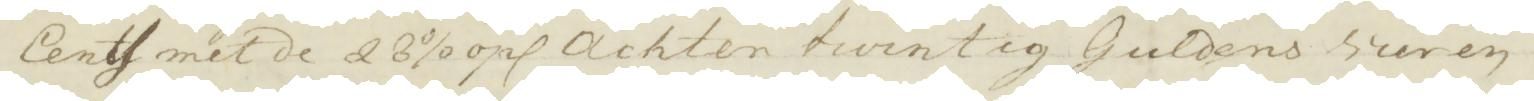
Cents met de 23% opc achten twintig Guldens vier en
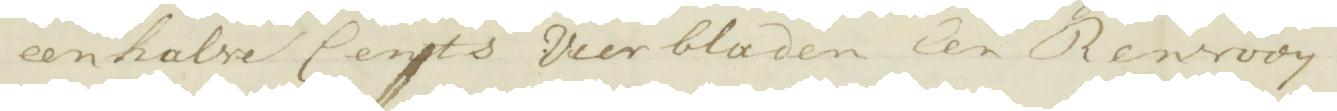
een halve Cents vier bladen Een Renvooy.
